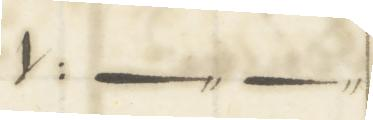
1: —„—„
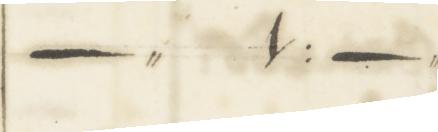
—„ 1: —
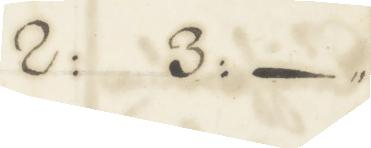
2: 3: —„
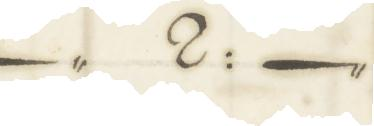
— „ 2: —„
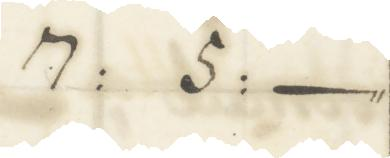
7: 5: —„
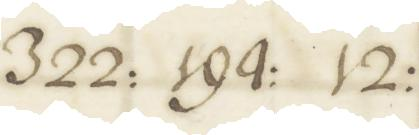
322: 194: 12:
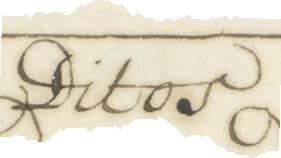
Ditos
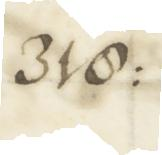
318:
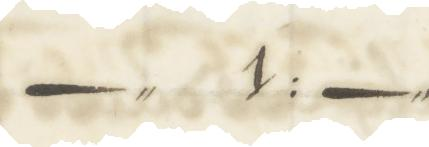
—„ 1: —,
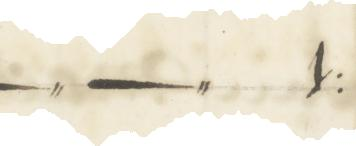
-„ —„ 1:
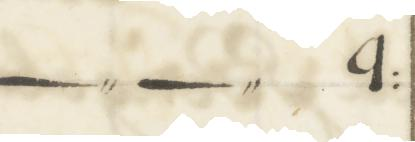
—„—„ 4:
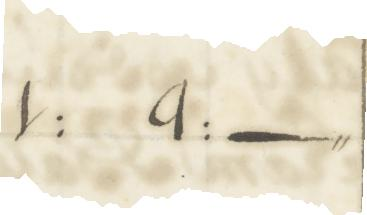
1: 4:—„
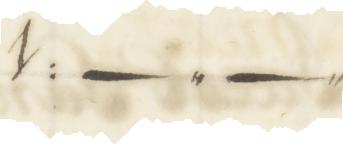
1:—„—,
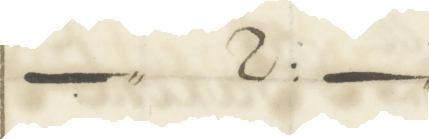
— „ 2:—„
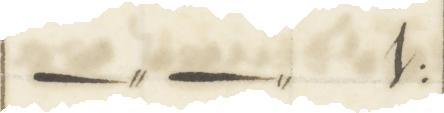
— „ —„ 1:
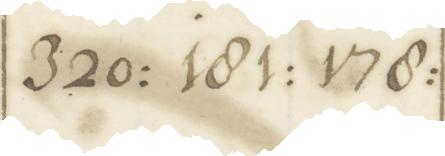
320: 181: 178:
